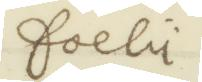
foelij
